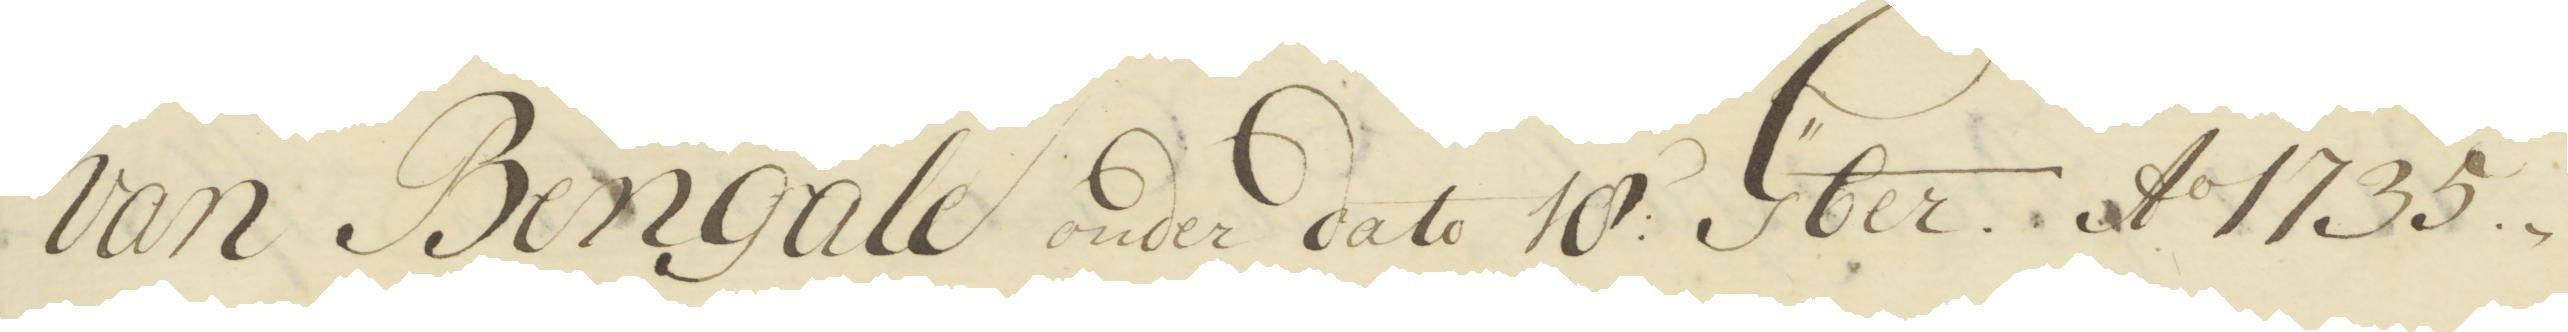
Van Bengale onder dato 18:' Gber. Ao 1735: –
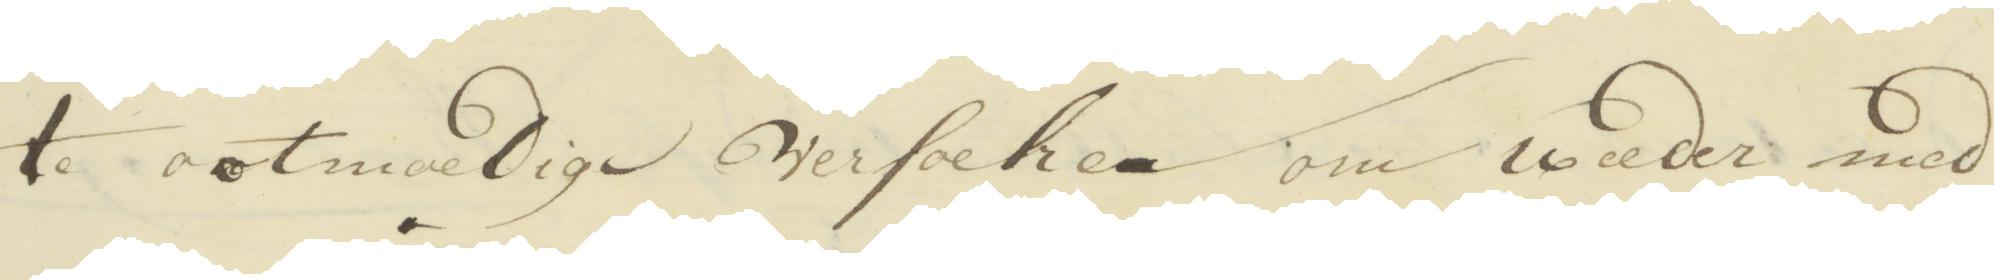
te ootmoedige versoeken om weeder med
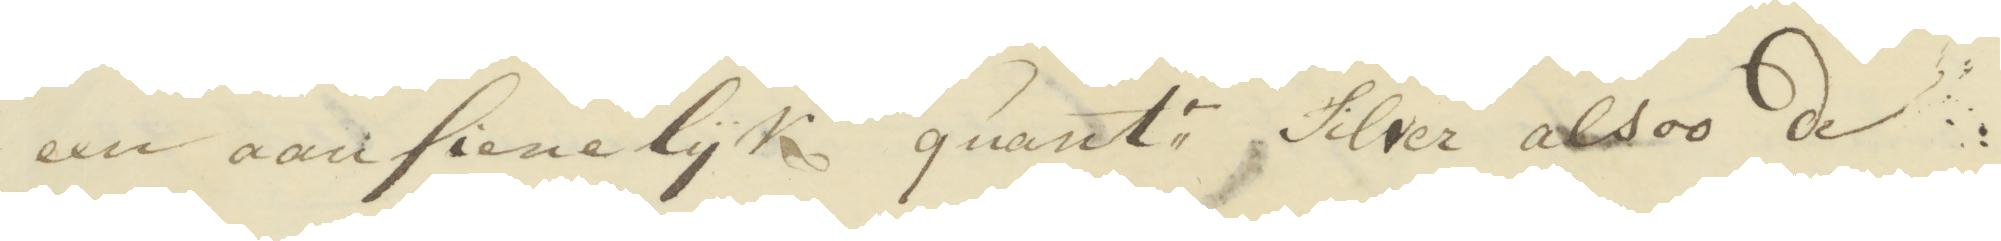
een aansienelijk quant„t, silver alsoo de
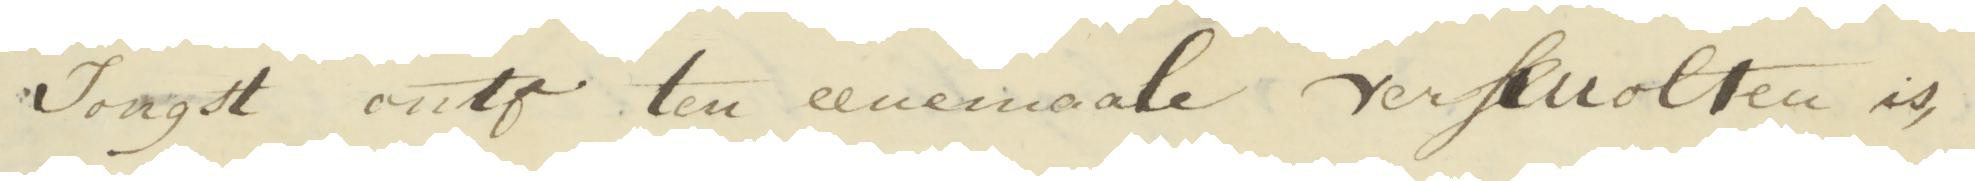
Iongst ontf ten eenemaale versmolten is,
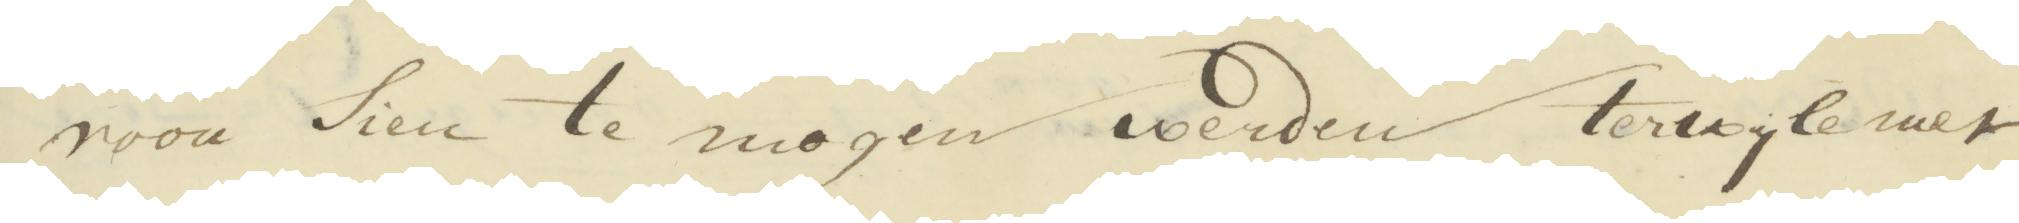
voor sien te mogen werden terwijle met
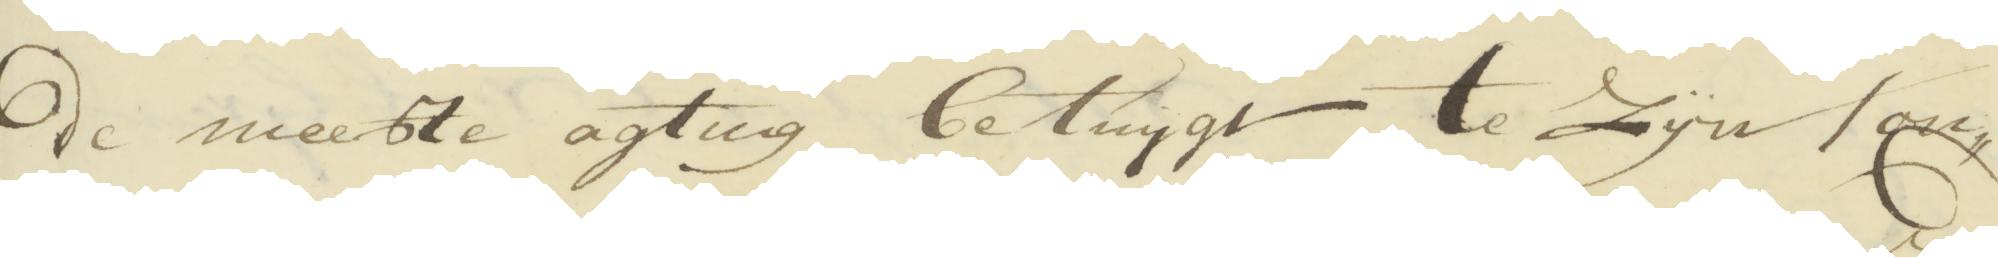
de meeste agting betuijgt te zijn / on„
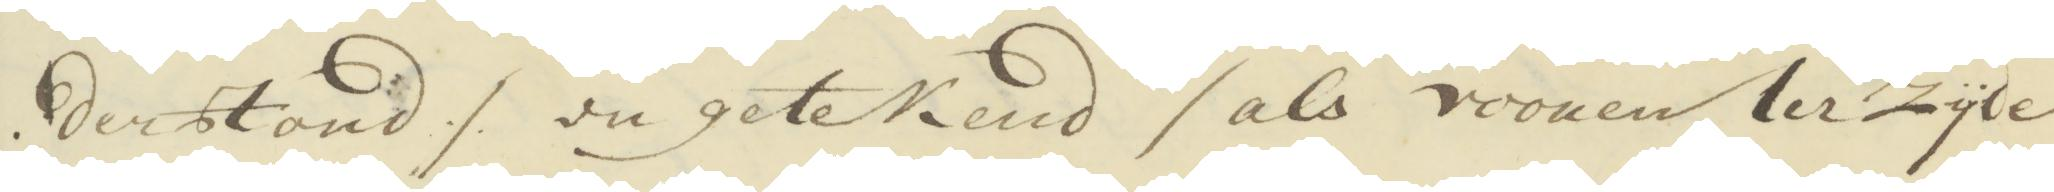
„derstond ./. en getekend / als vooren ter zijde
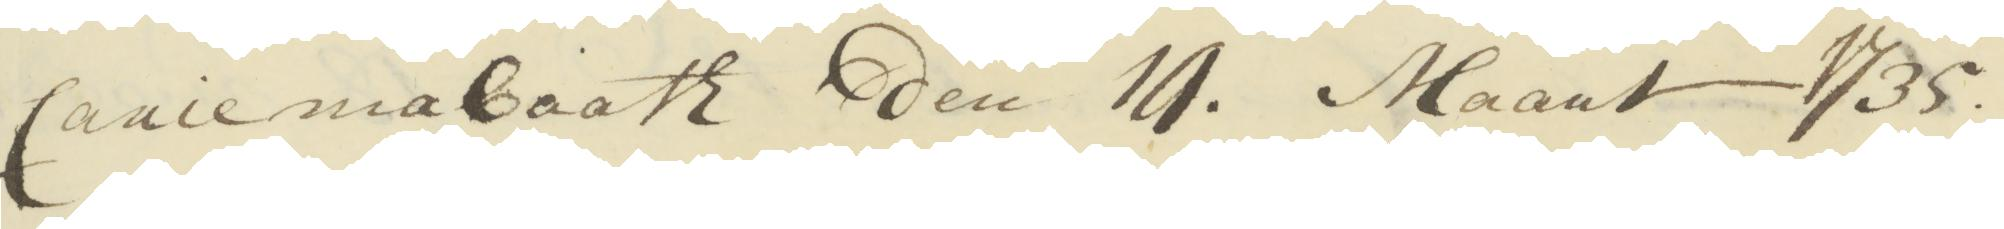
Cariemabaath den 14. Maart 1735.
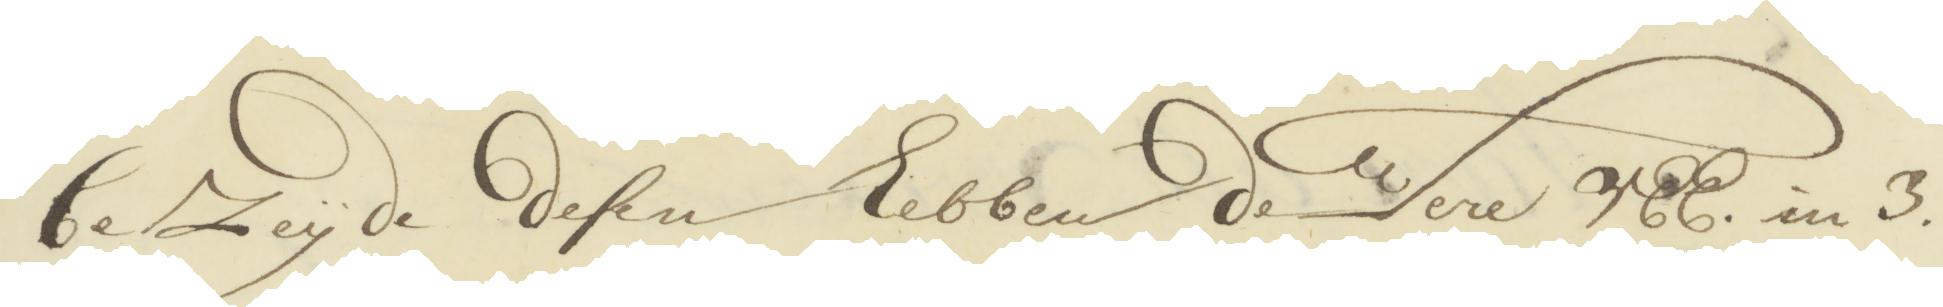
bezeijde desen hebben de Eere VEE. in 3.
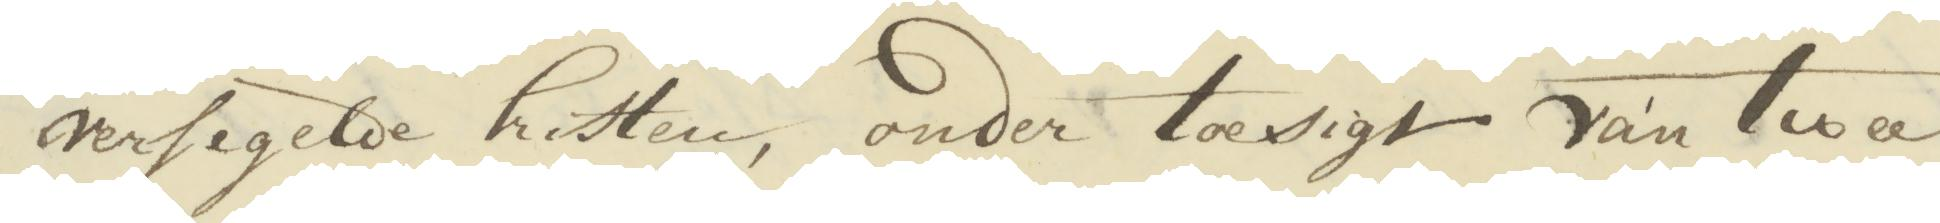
versegelde kisten, onder toesigt van twee
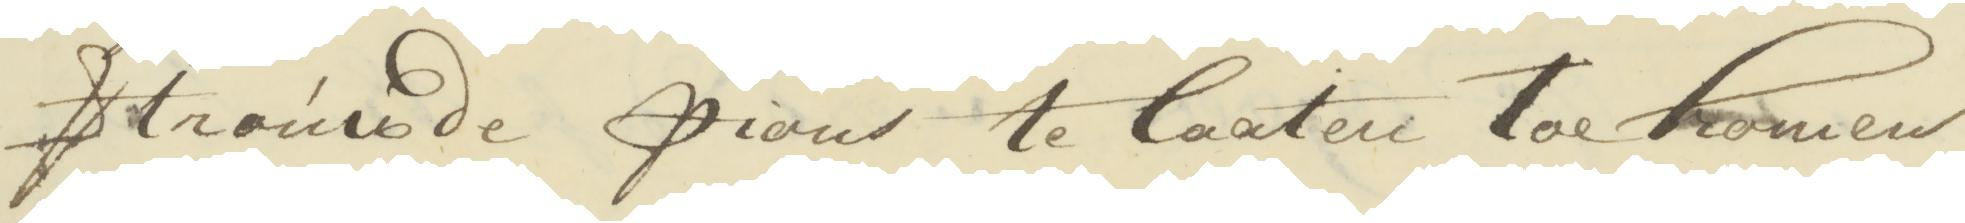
vertrouwde pions te laaten toe komen
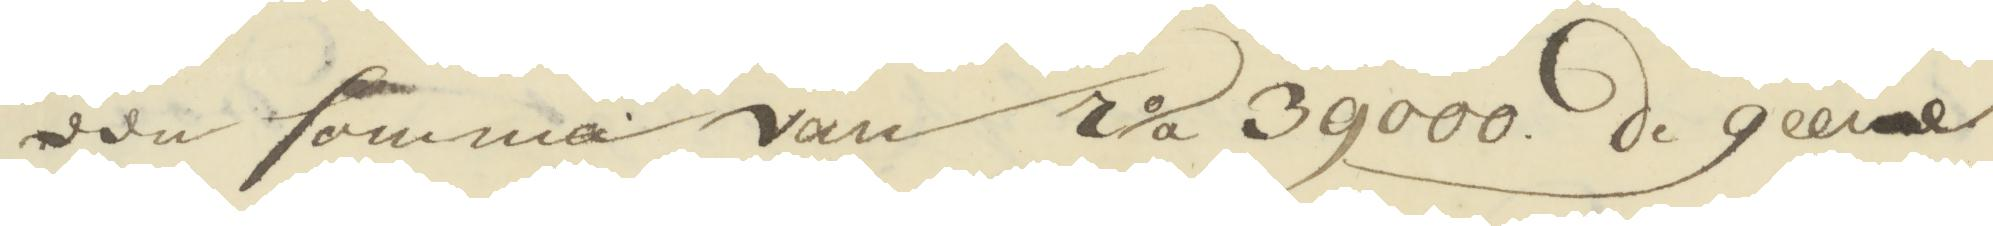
een somma van ro/a 39000. de geene
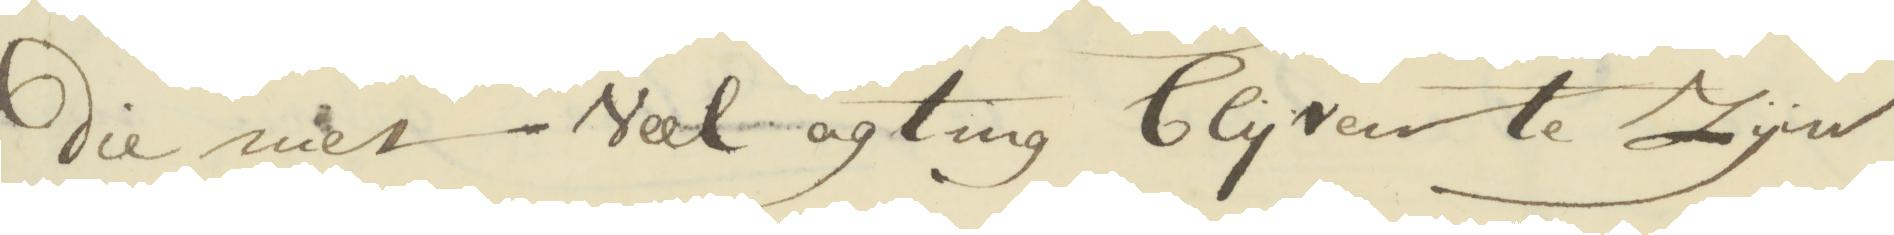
die niet veel agting blijven te zijn
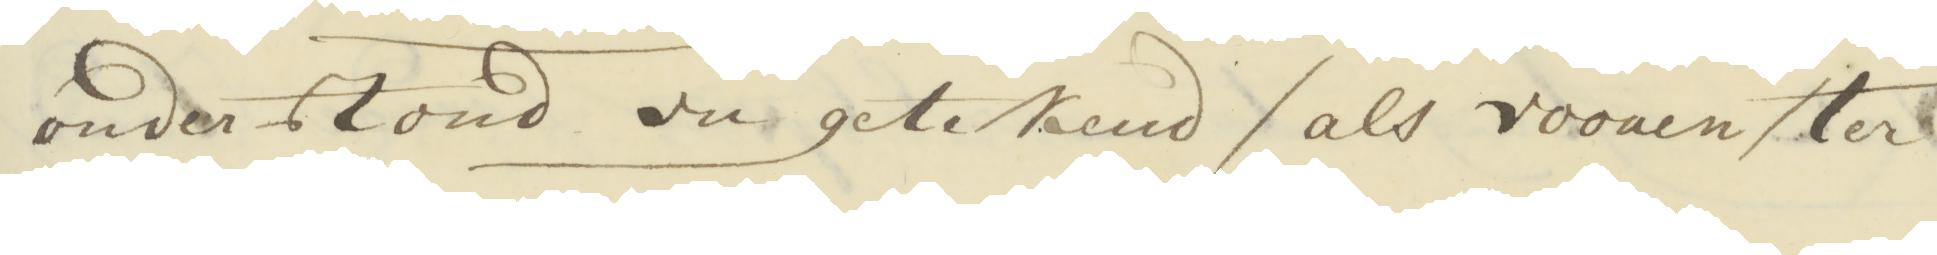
onderstond en getekend / als vooren / ter
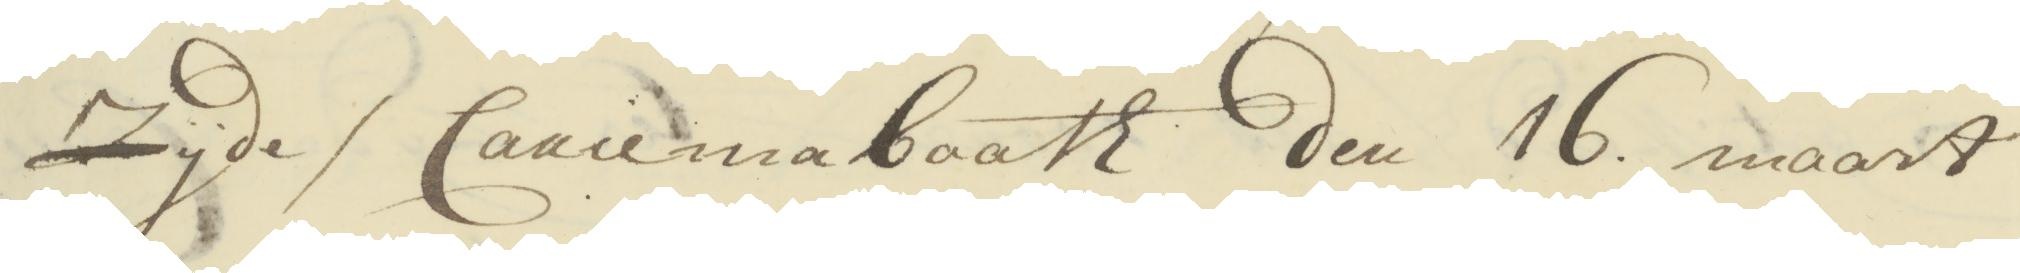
zijde / Cariemabaath den 16. maart
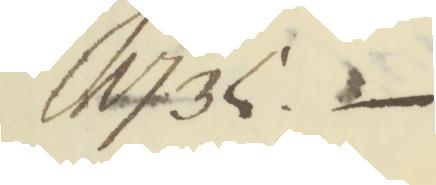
1735. —
